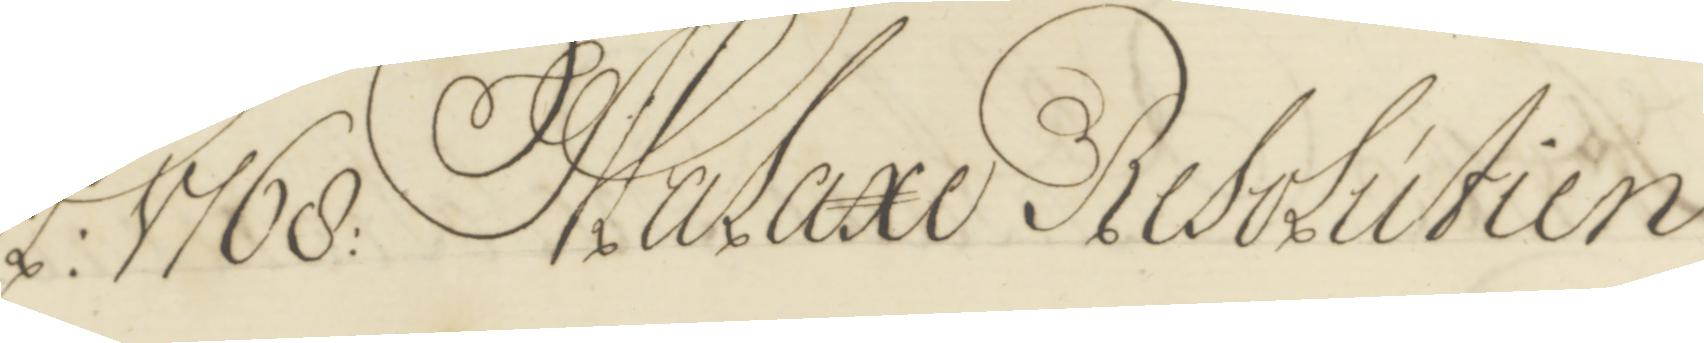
A:o 1768: Malaxe Resolutien
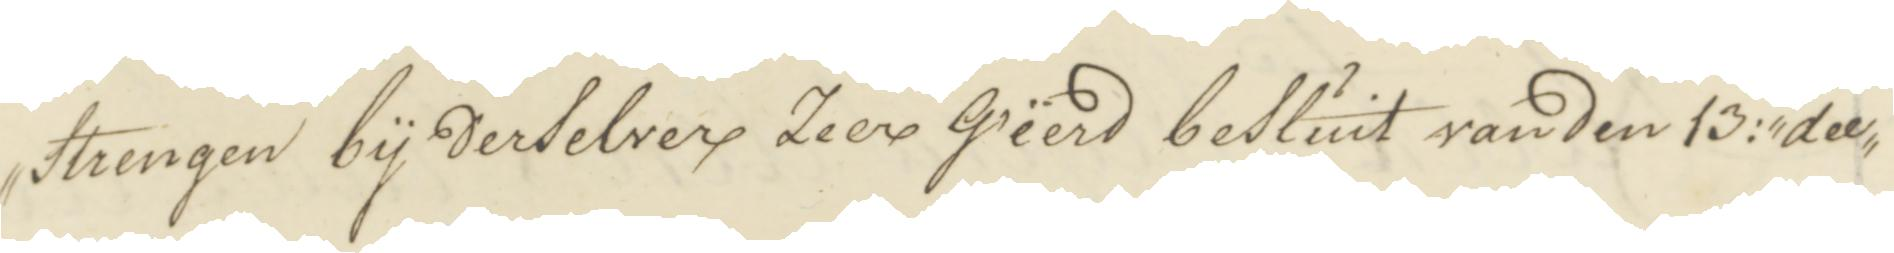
„strengen bij derselver zeer g'ëerd besluit van den 13:„a dee„
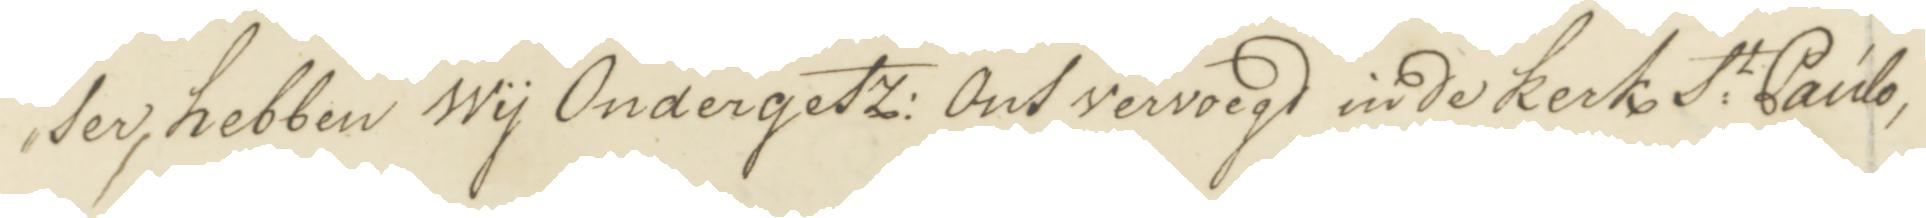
ser, hebben wij ondergesz: Ons vervoegd in de kerk s:t Paulo,
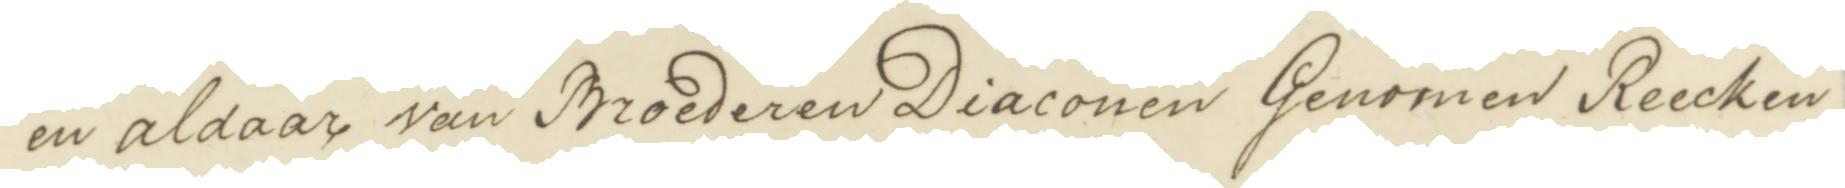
en aldaar van Broederen Diaconen Genomen Reecken
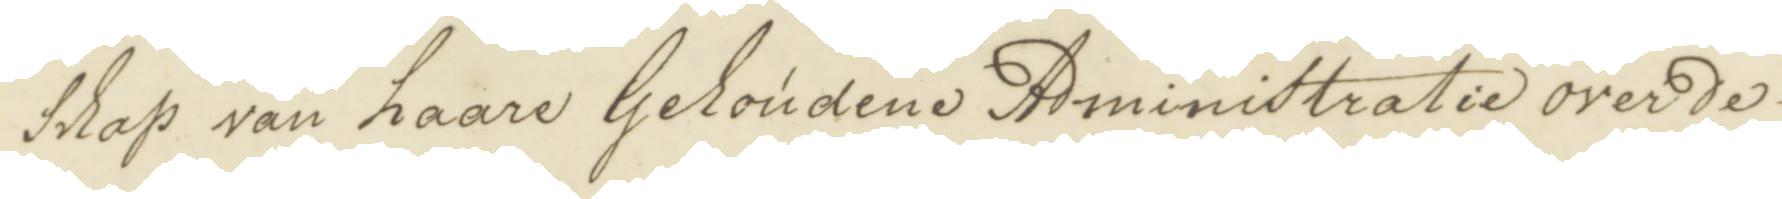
schap van haare Gehoudene Administratie over de
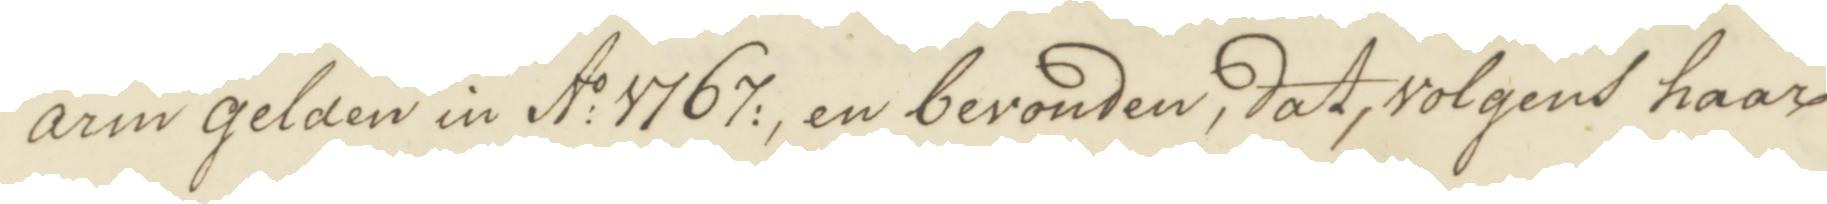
arm gelden in A:o 1767:, en bevonden, dat, volgens haar
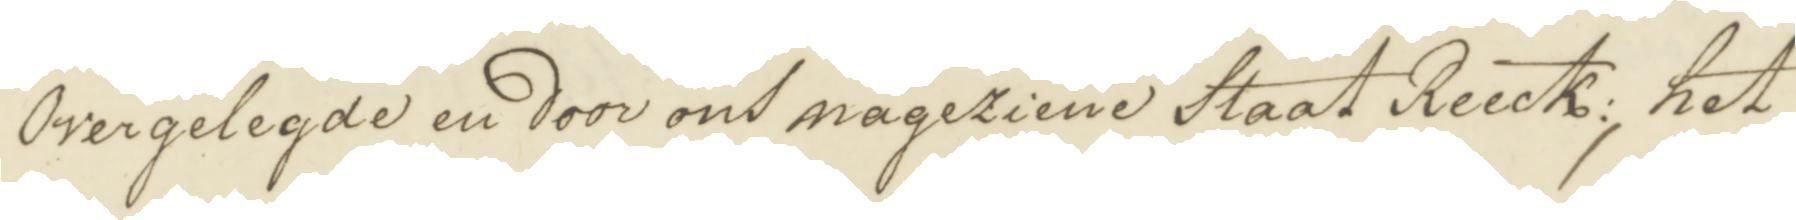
Overgelegde en door ons nageziene staat Reeck:, het
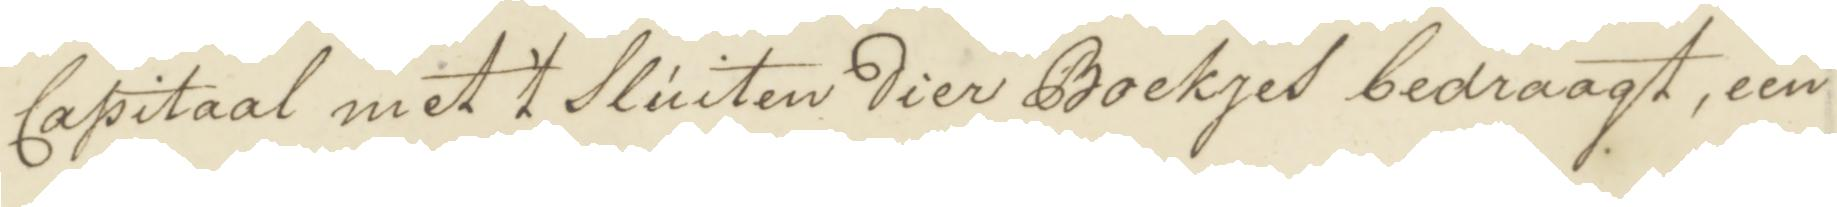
Capitaal met 't sluiten dier Boekjes bedraagt, een
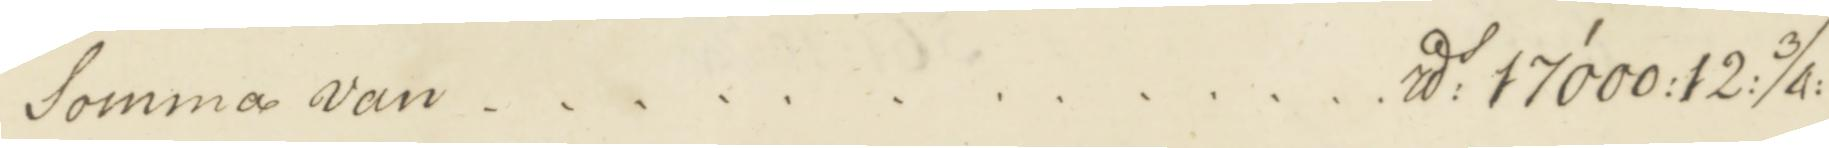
somma van - - - - - - - - - - - - - rd:s 17'000:12:¾:
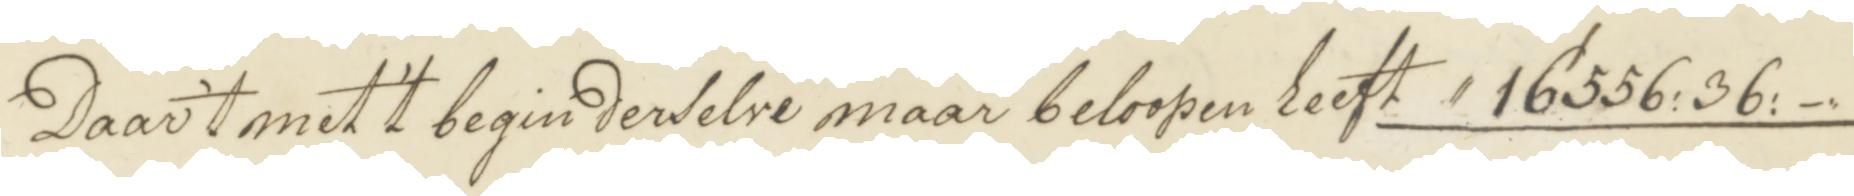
Daar ’t met ’t begin derselve maar beloopen heeft „ 16'556:36:-„
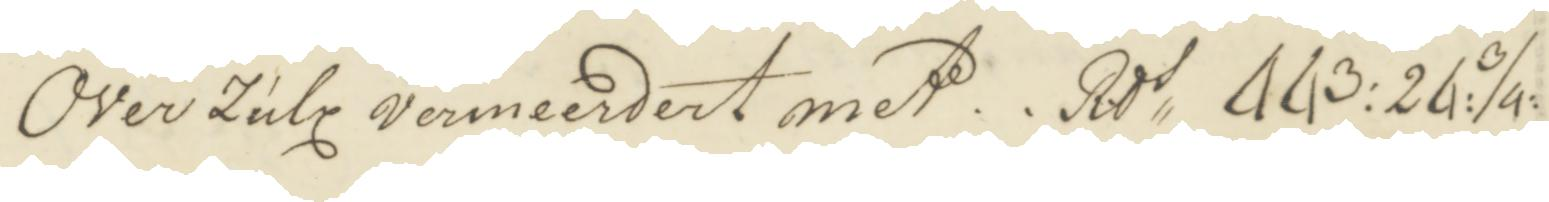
Over zulx vermeerdert met . . Rd„s 443:24:¾:
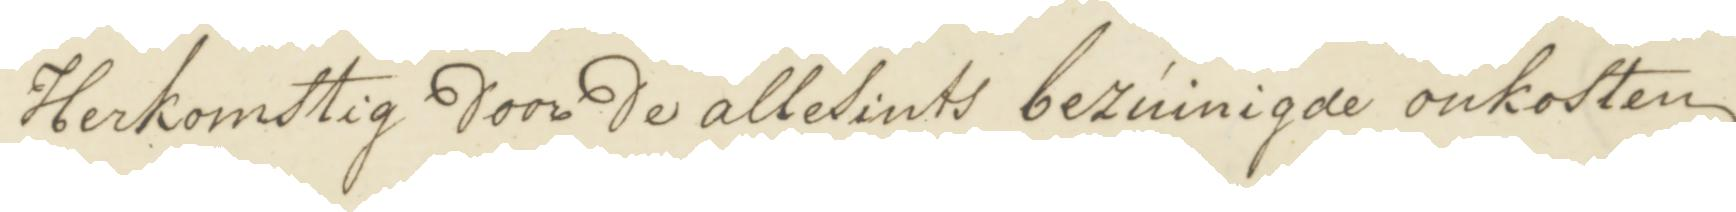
Herkomstig door de allesints bezuinigde onkosten
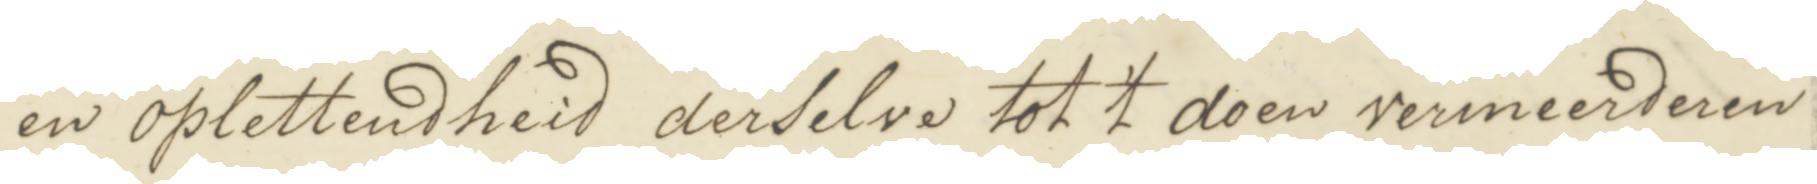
en oplettendheid derselve tot ’t doen vermeerderen
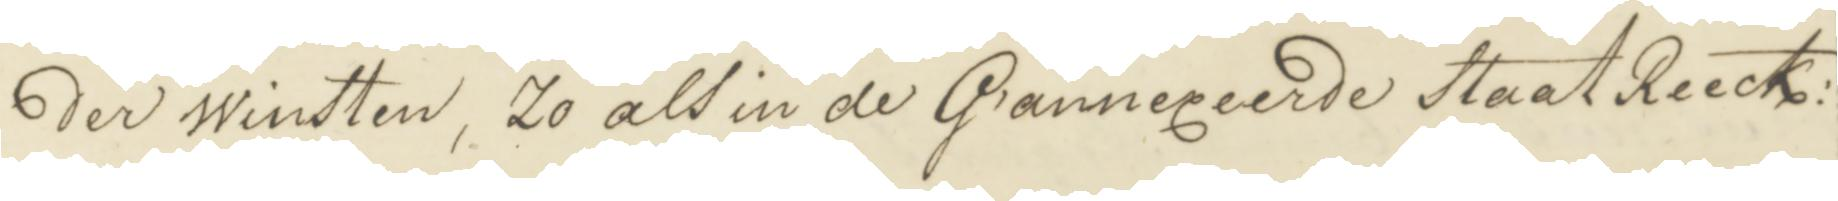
der winsten, zo als in de G'annexeerde staat Reeck:
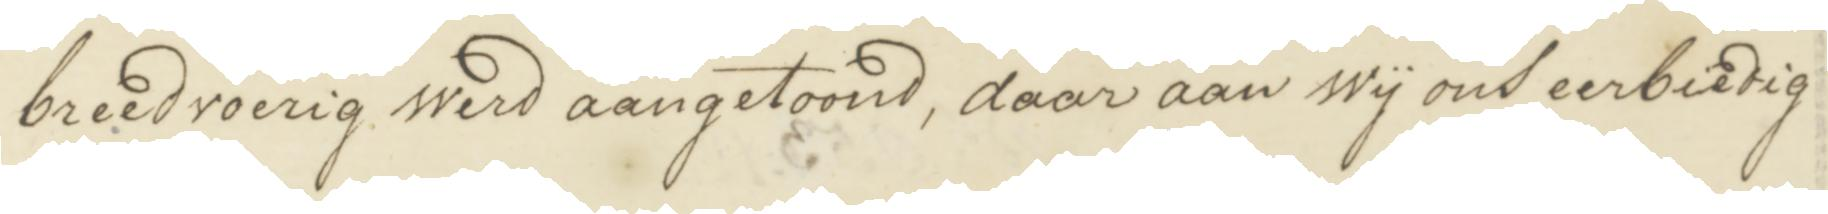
breedvoerig werd aangetoond, daar aan wij ons eerbiedig
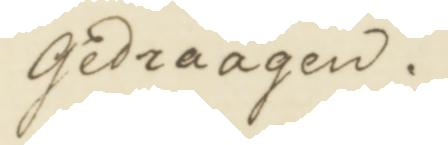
gedraagen.
